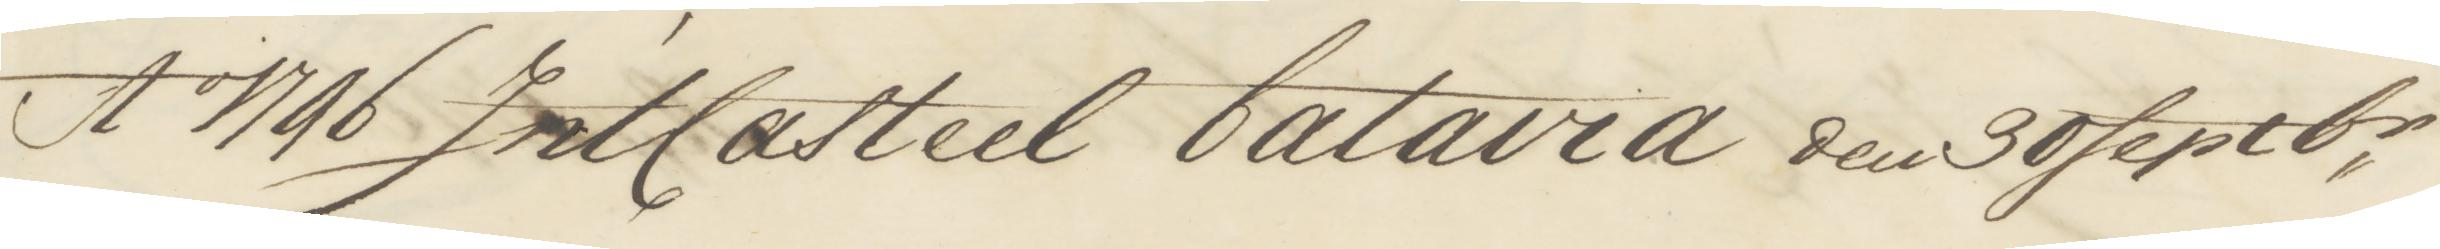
Ao 1746 Jn't Casteel batavia den 30 septb„r
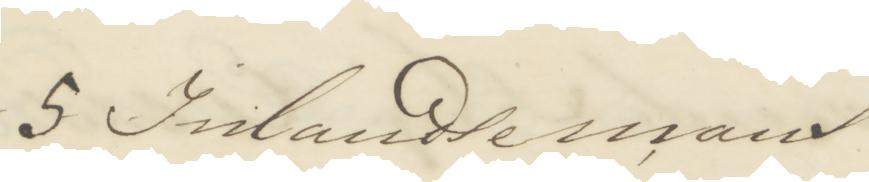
5 Inlandse mans
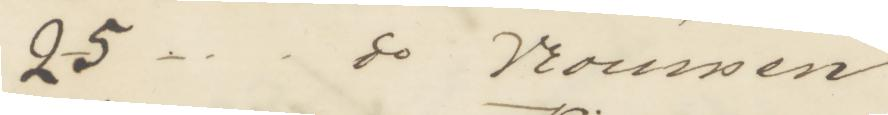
25 - - - d:o vrouwen
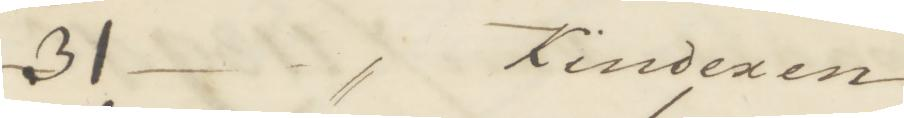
31 „ Kinderen
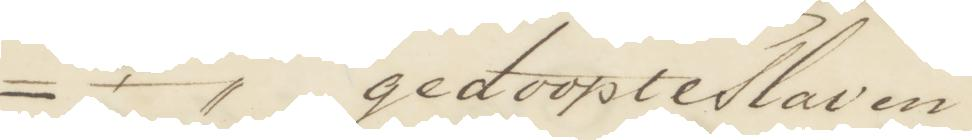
„ gedoopte Slaven
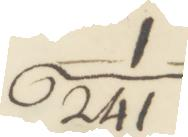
1/241
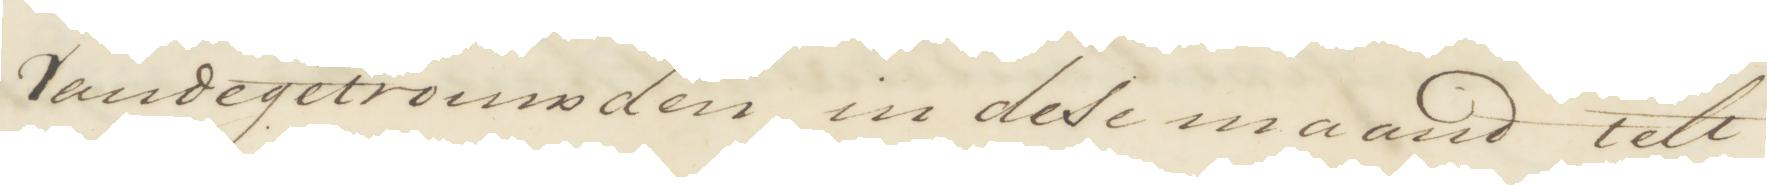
van de getrouwden in dese maand telt
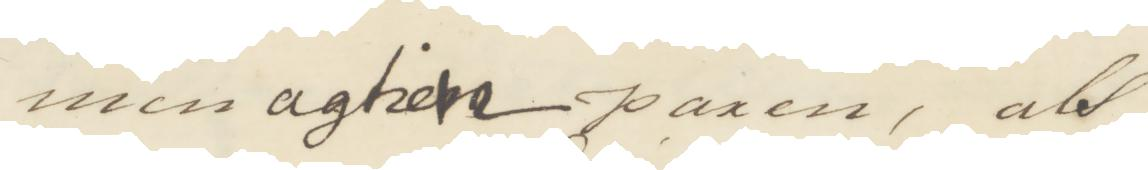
men agtien paren, als
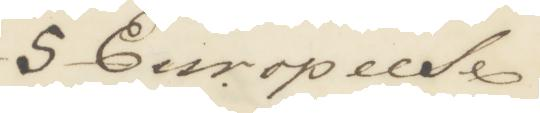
5 Europeese
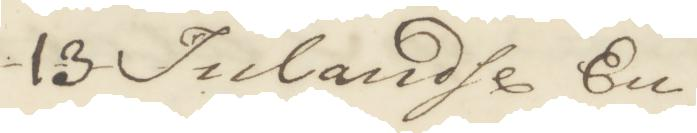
13 Inlandse En
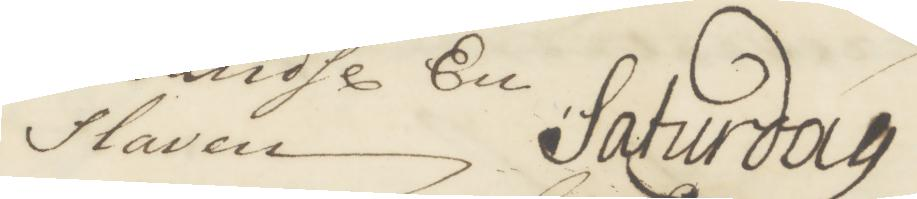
slaven Saturdag
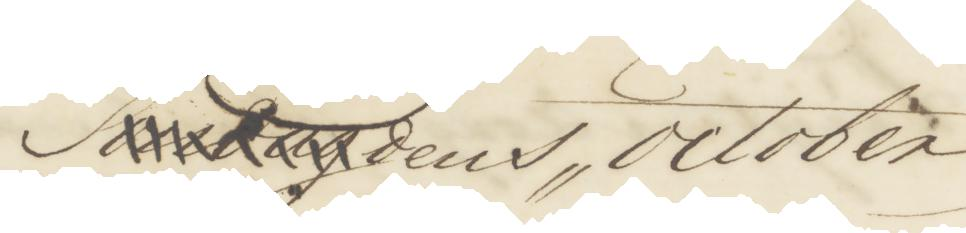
Sondag den 1„ october
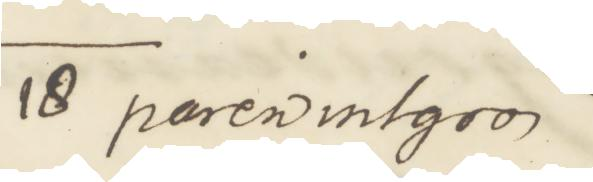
18 paren in t gso
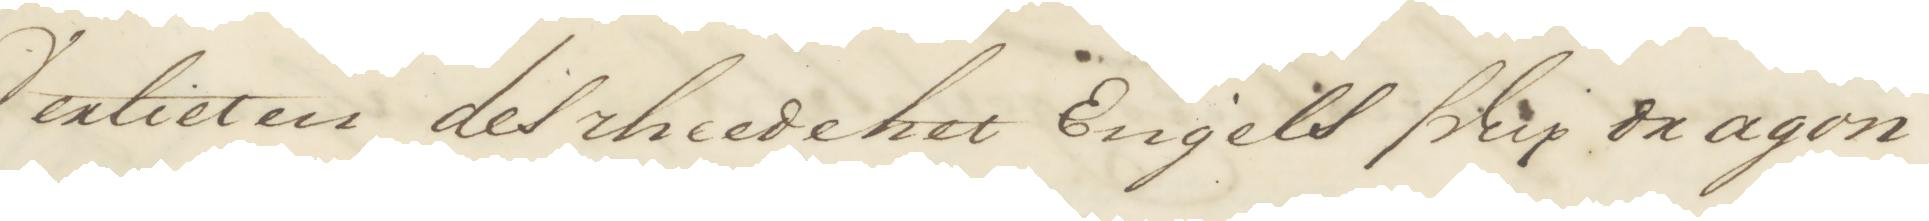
Verlieten des rheede het Engels schip dragon
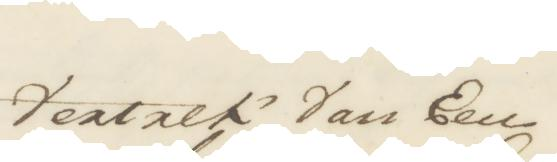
Vertrek van Een
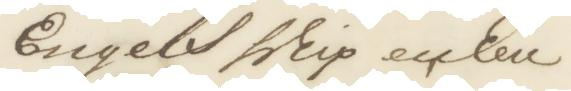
Engels schip en Een
